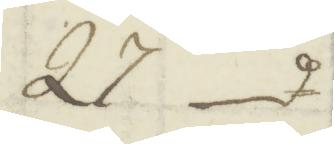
27: _o
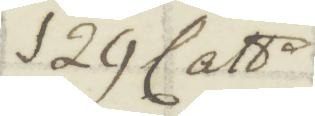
129 Catts
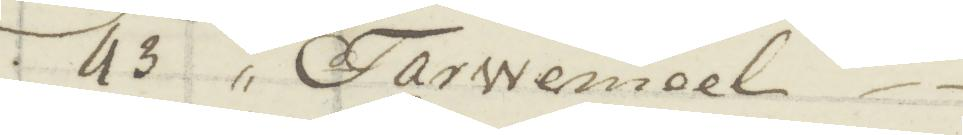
43 „ Tarwemeel -
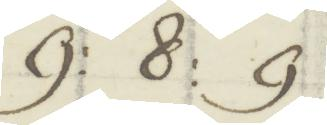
9: 8: 9
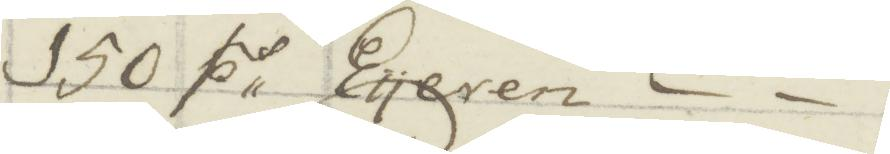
150 p„s Eijeren - -
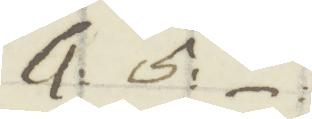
4: 5: -:
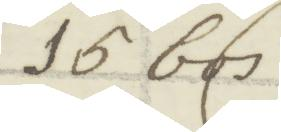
15 bos
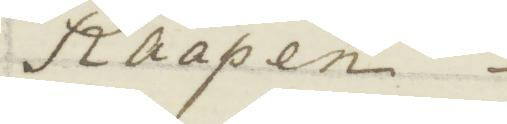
Raapen
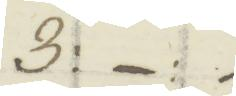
3: -:
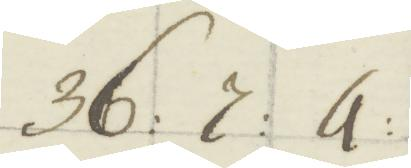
36: 7: 4:
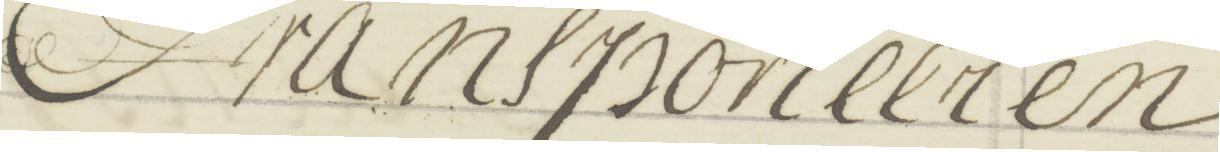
Transporteeren
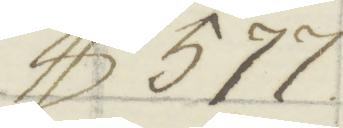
H 577:
